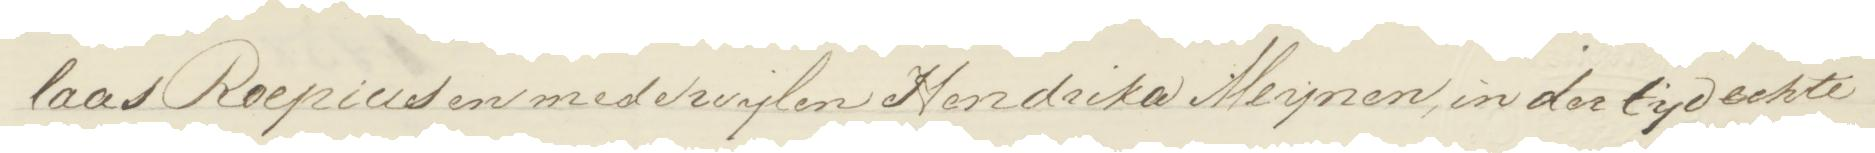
laas Roepius en medewijlen Hendrika Meijnen, in der tijd echte
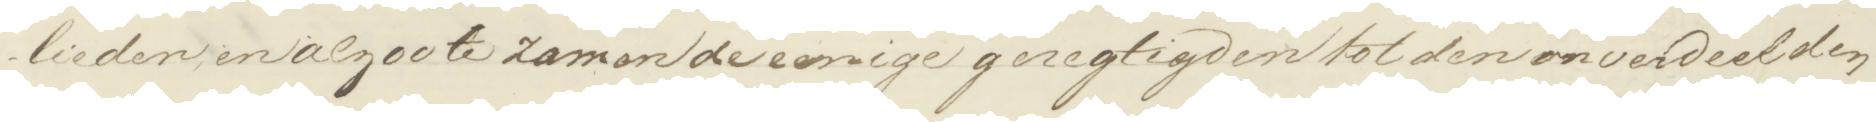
lieden, en alzoo te zamen de eenige geregtigden tot den onverdeelden
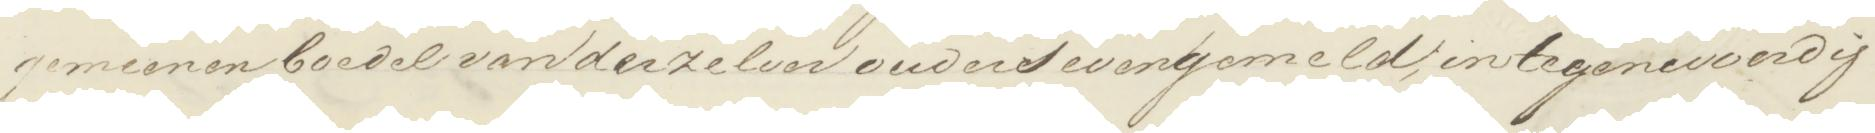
gemeenen boedel van derzelver ouders evengemeld, in tegenwoordig
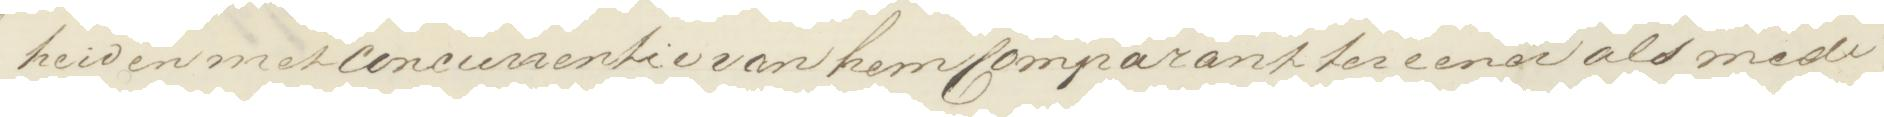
heid en met concurrertie van hem Comparant ter eener als mede
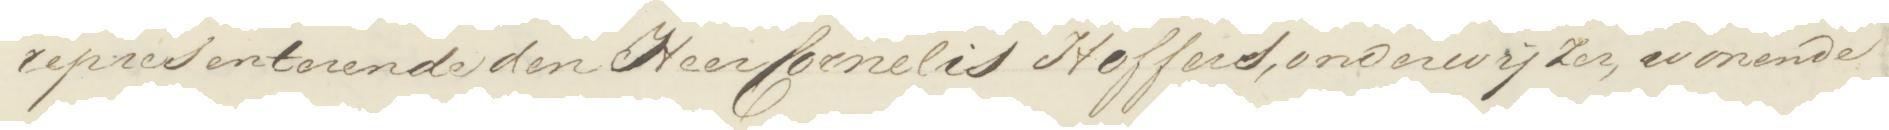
representerende den Heer Cornelis Hoffers, onderwijzer, wonende
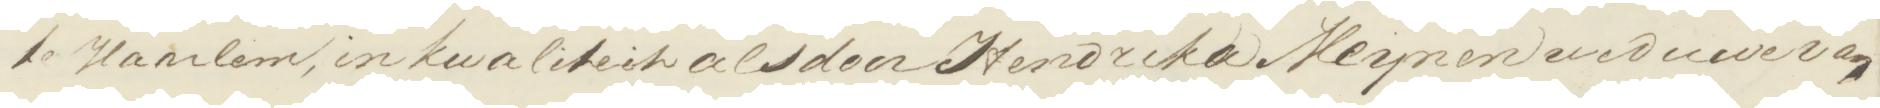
te Haarlem, in kwaliteit als door Hendrika Meijnen weduwe van
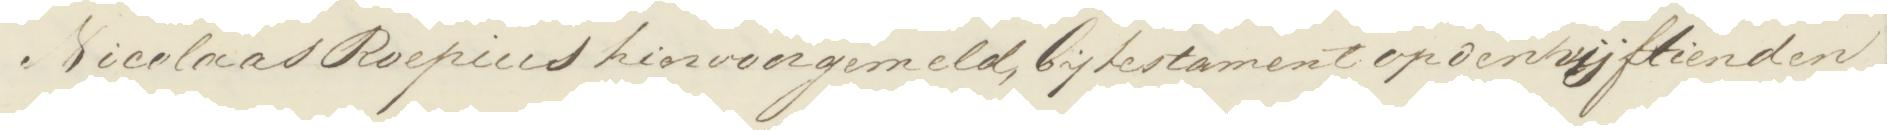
Nicolaas Roepius hier voorgemeld, bij testament op den vijftienden
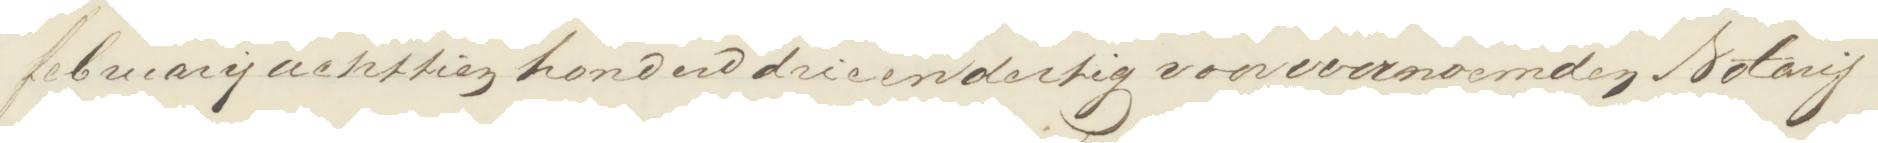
februarij achttien honderd drie en dertig voor voornoemden Notaris
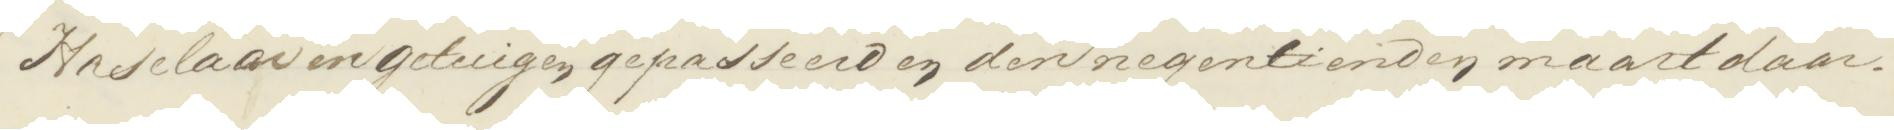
Haselaar en getuigen gepasseerd en den negentienden maart daar.
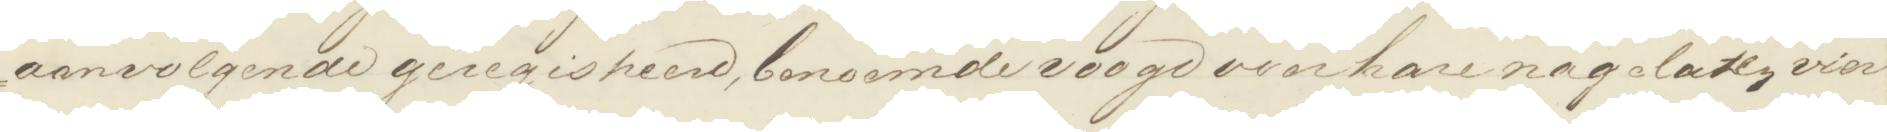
aanvolgende geregistreerd, benoemde voogd voor hare nagelaten vier
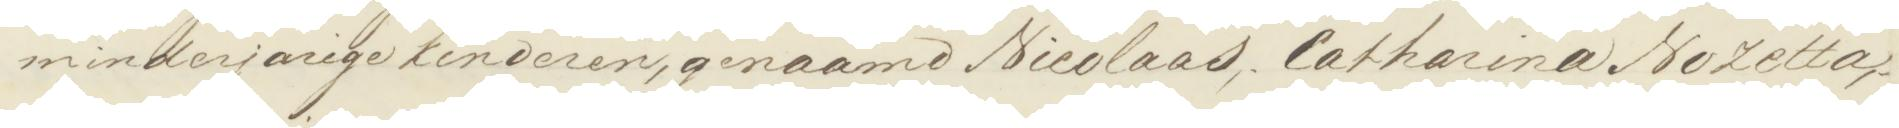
minderjarige kinderen, genaamd Nicolaas, Catharina Nozetta,
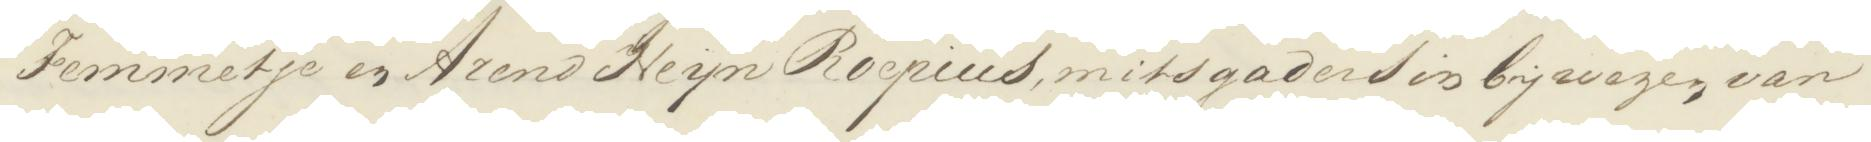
Femmetje en Arend Heijn Roepius, mitsgaders in bij wezen van
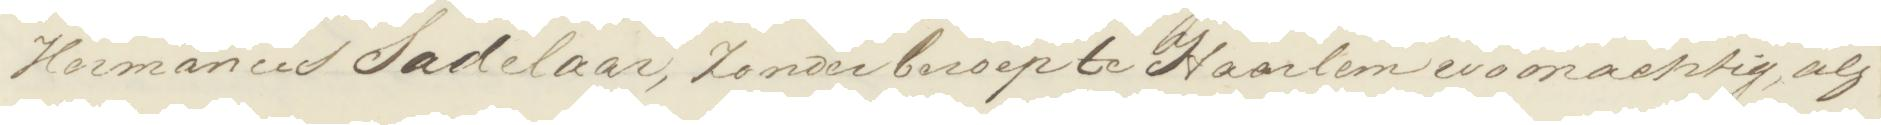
Hermanus Sadelaar, zonder beroep te Haarlem woonachtig, als
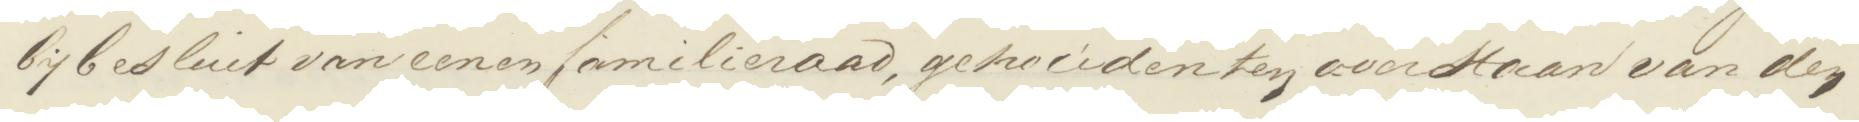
bij besluit van eenen familieraad, gehouden ten overstaan van den
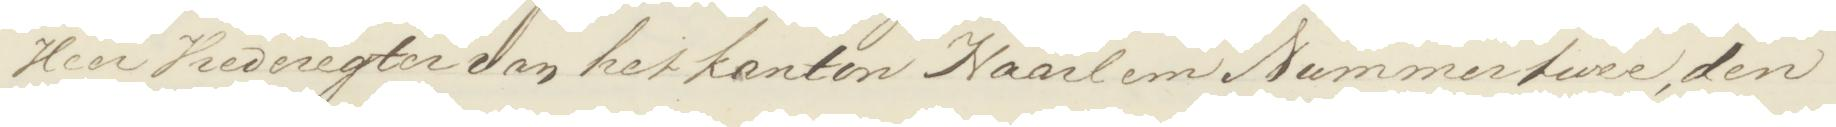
Heer Vrederegter van het kanton Haarlem Nummer twee, den
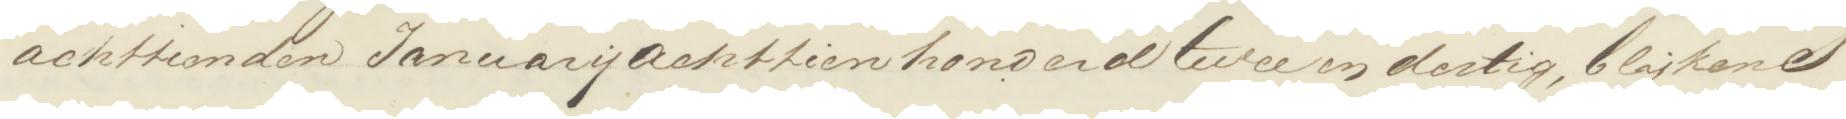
achttienden Januarij achttien honderd twee en dertig, blijkens
